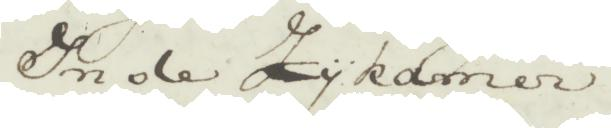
In de Zijkamer
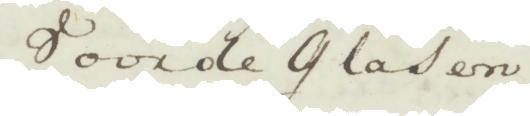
Voor de Glasen
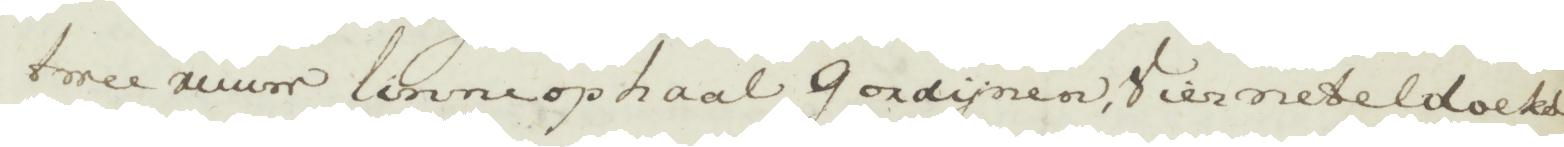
twee ruuw linne op haal Gordijnen, Vier neteldoeks
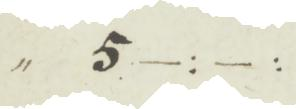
„ 5: —: —:
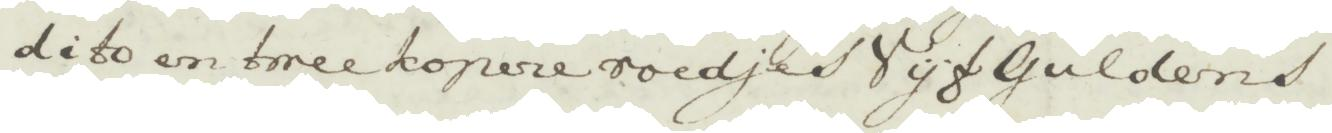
dito en twee kopere roedjes Vijf Guldens
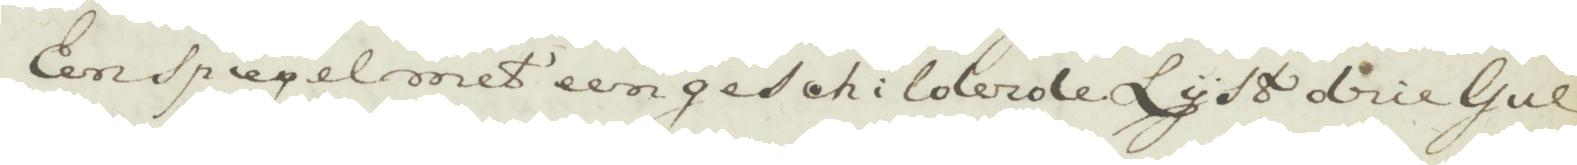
Een spiegel met een geschilderde Lijst drie Gul
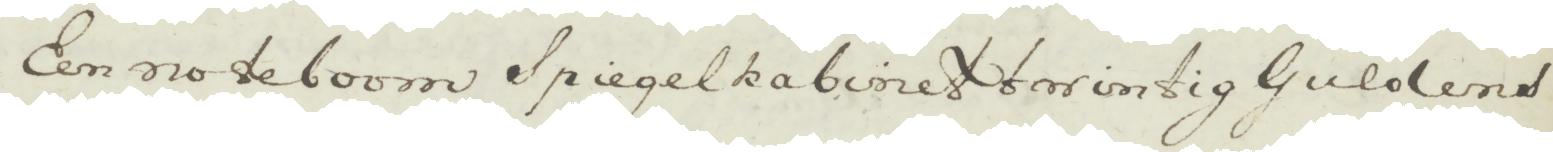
Een noteboom spiegelkabinet twintig Guldens
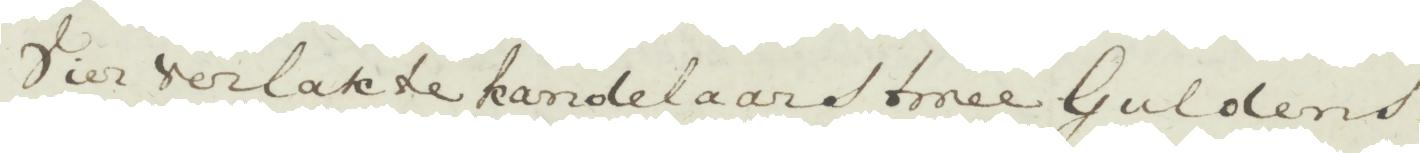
Vier verlakte kandelaars twee Guldens
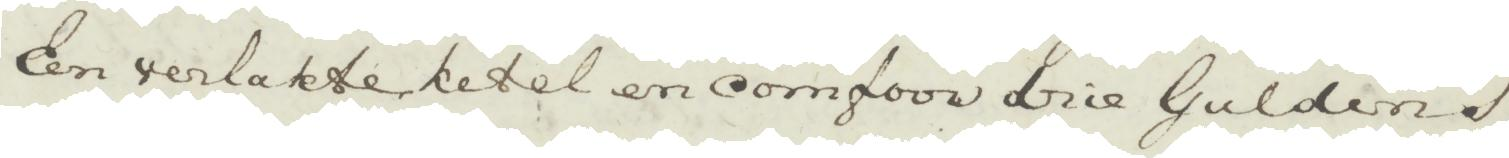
Een verlakte, ketel en comfoor drie Guldens
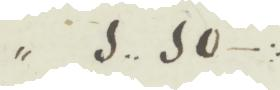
„ 1.. 10 —
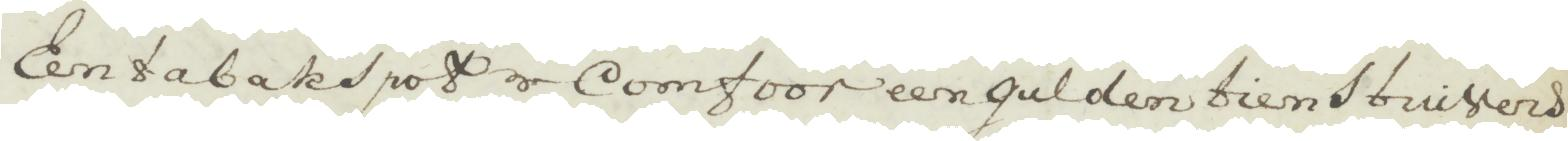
Een tabakspot en Comfoor een gulden tien stuiver
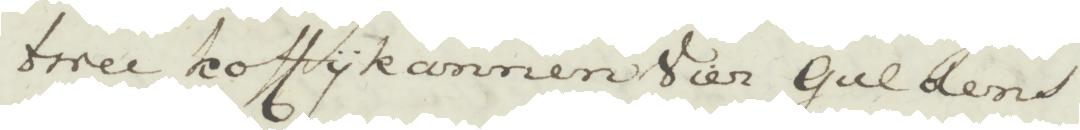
twee koffijkannen Vier Guldens
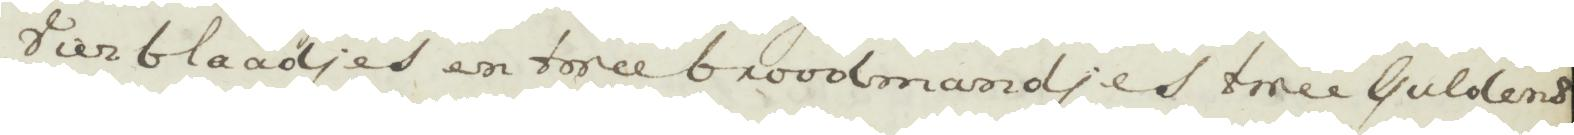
Vier blaadjes en twee broodmandjes twee Gulden
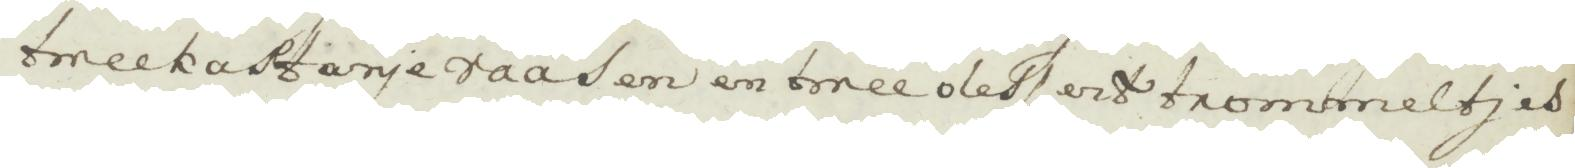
twee kastanje vaasen en twee dessert trommeltjes
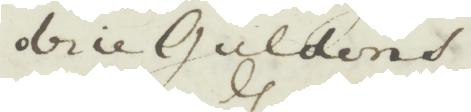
drie Guldens
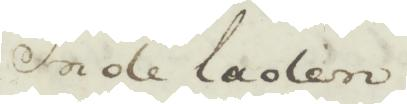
In de laden
